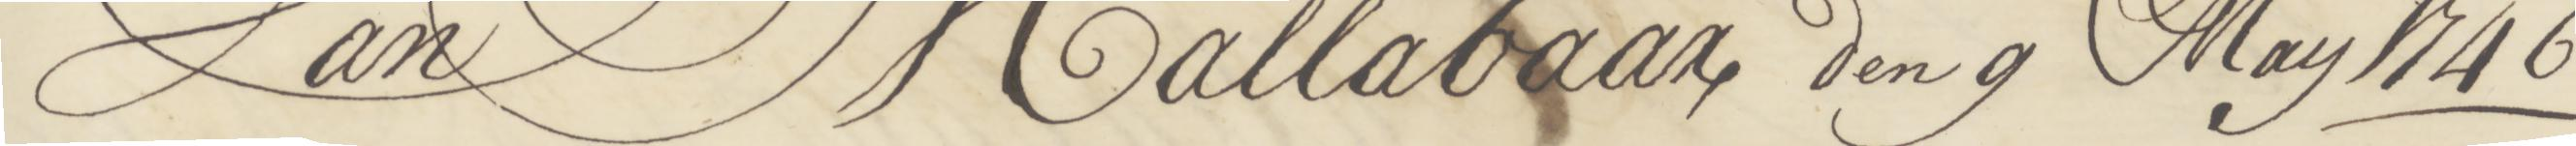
Van Mallabaar den 9 May 1746
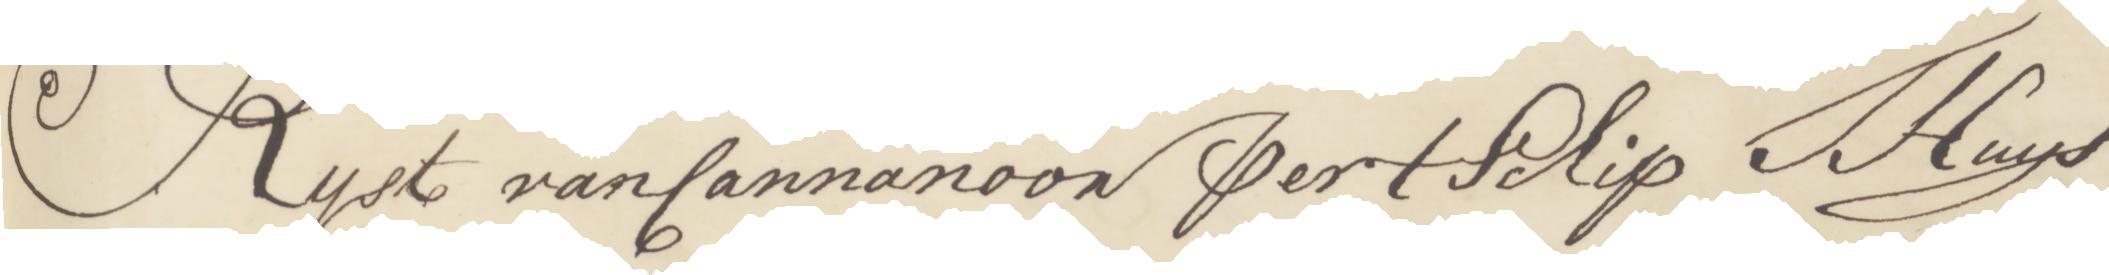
Ryst van Cannanoor per t schip THuys
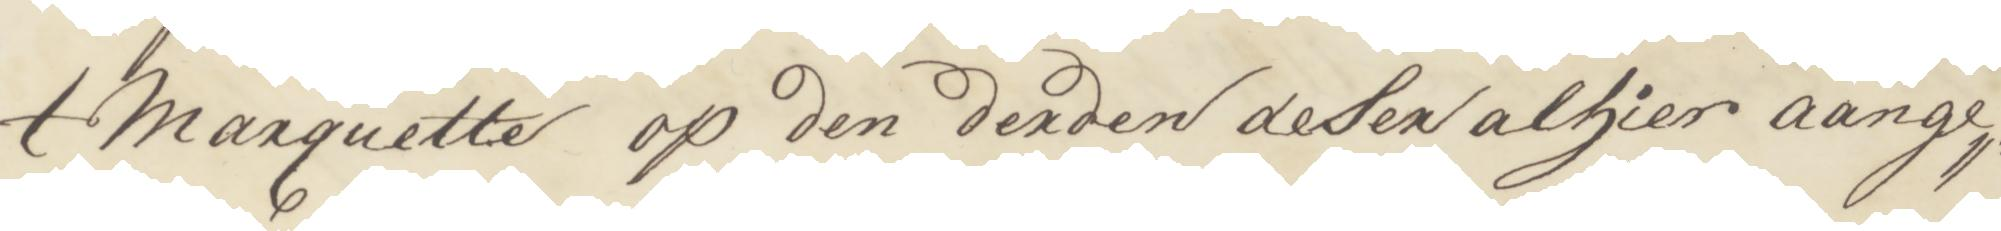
t Marquette op den derden deser alhier aange„
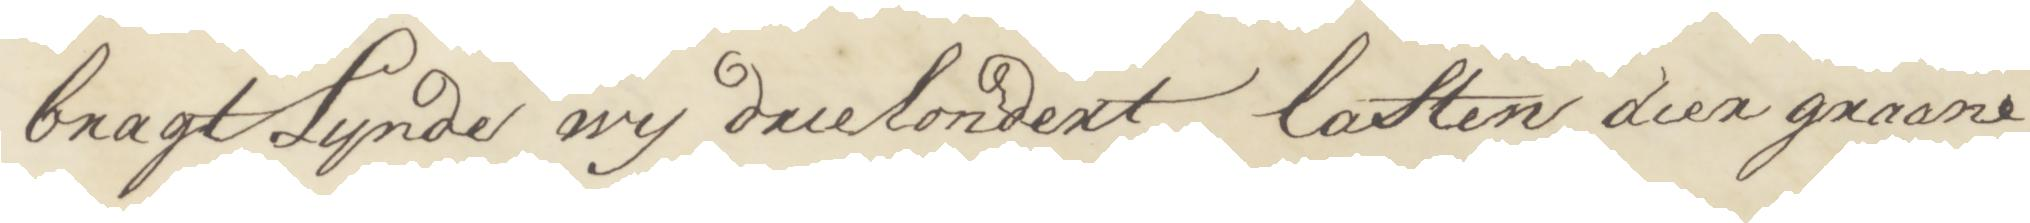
bragt synde wij driehondert lasten dier graane
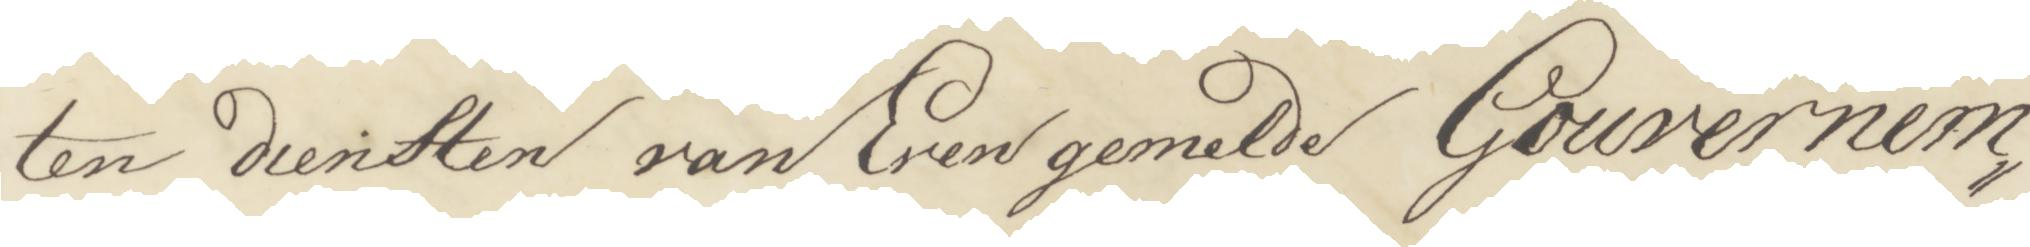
ten diensten van Even gemelde Gouvernem„
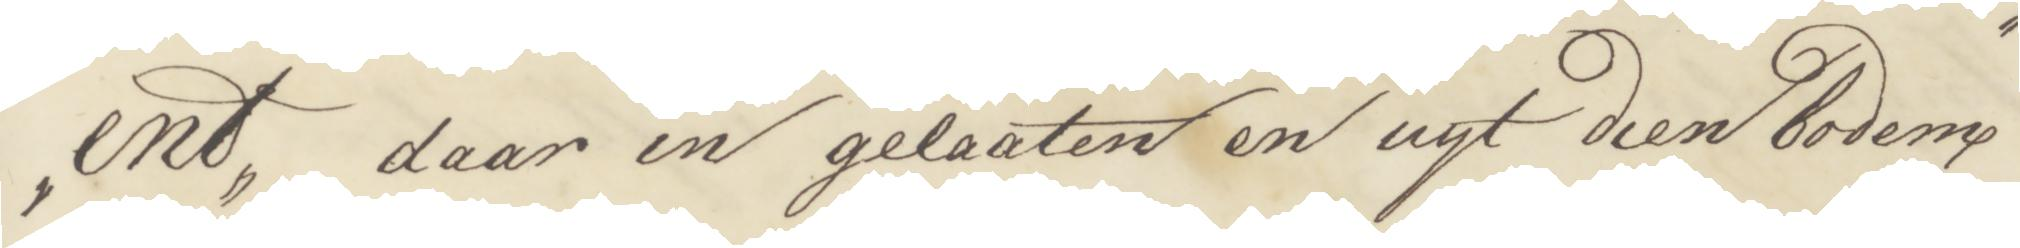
„ent„ daar in gelaaten en uyt dien bodem
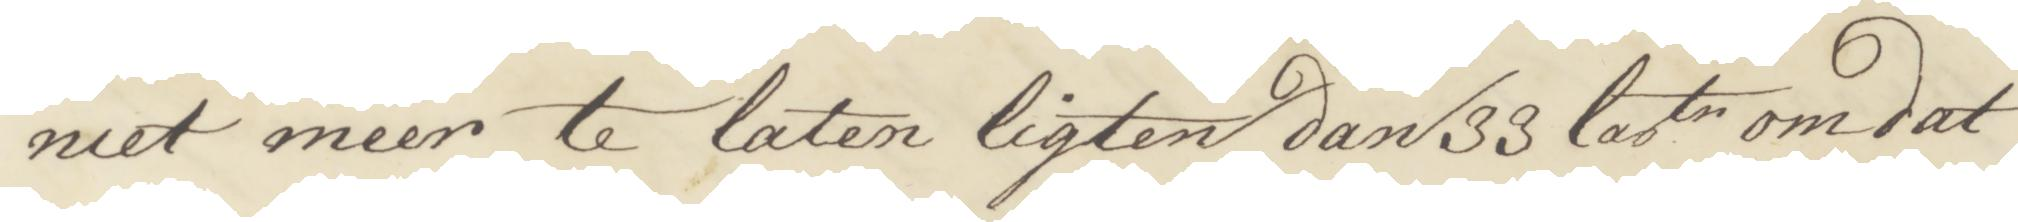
niet meer te laten ligten dan 33 lastn om dat
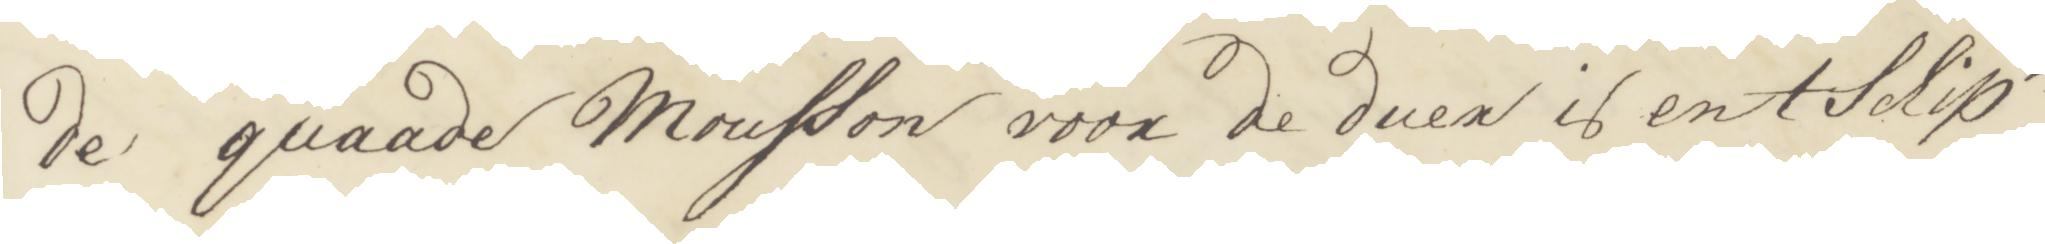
de quaade Mousson voor de duer is en t schip
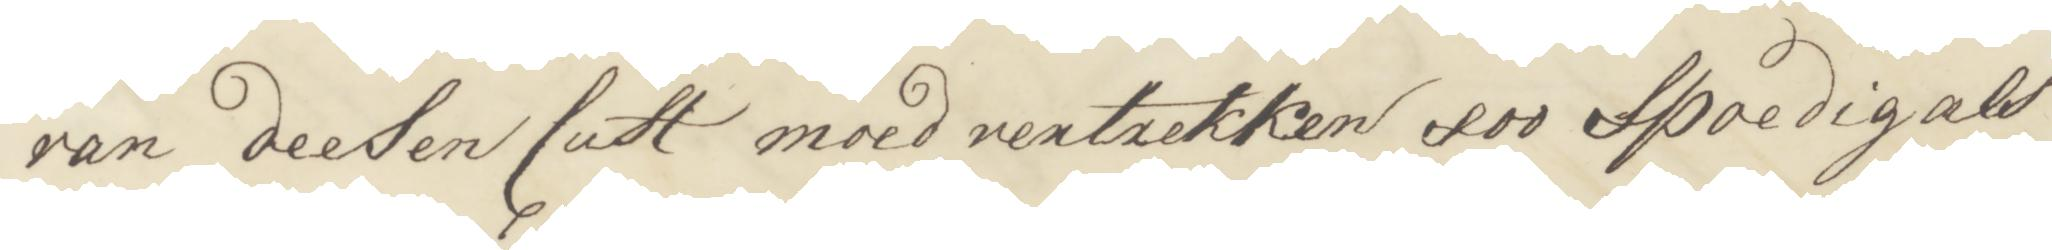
van deesen Cust moed vertrekken soo spoedig als
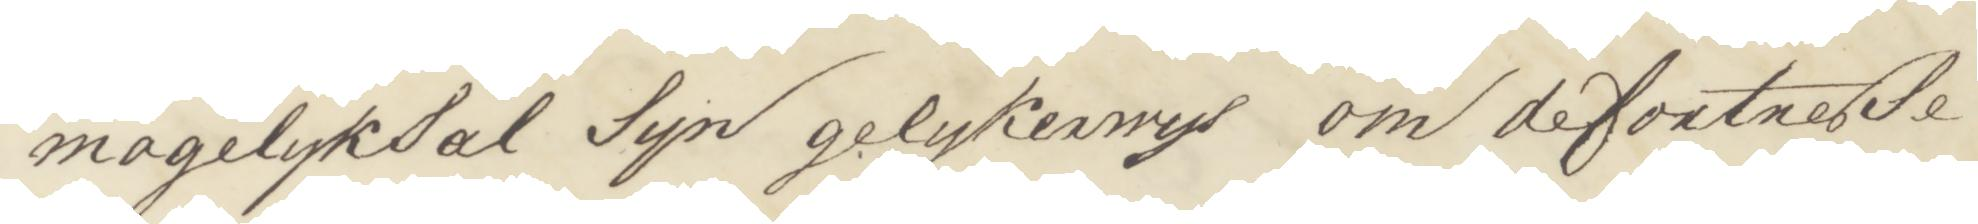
mogelyk sal syn gelykerwys om de fortresse
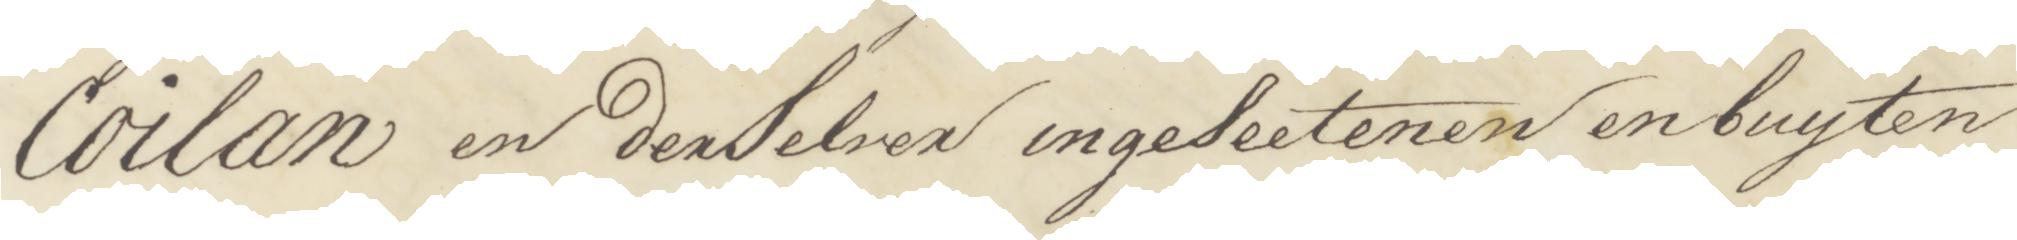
Coilan en derselver ingeseetenen en buyten
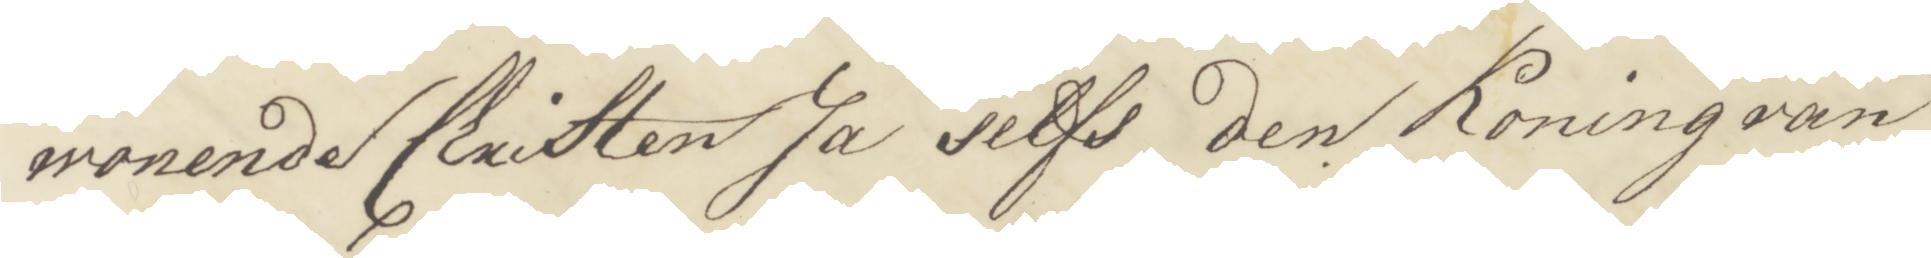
wonende Christen Ja selfs den Koning van
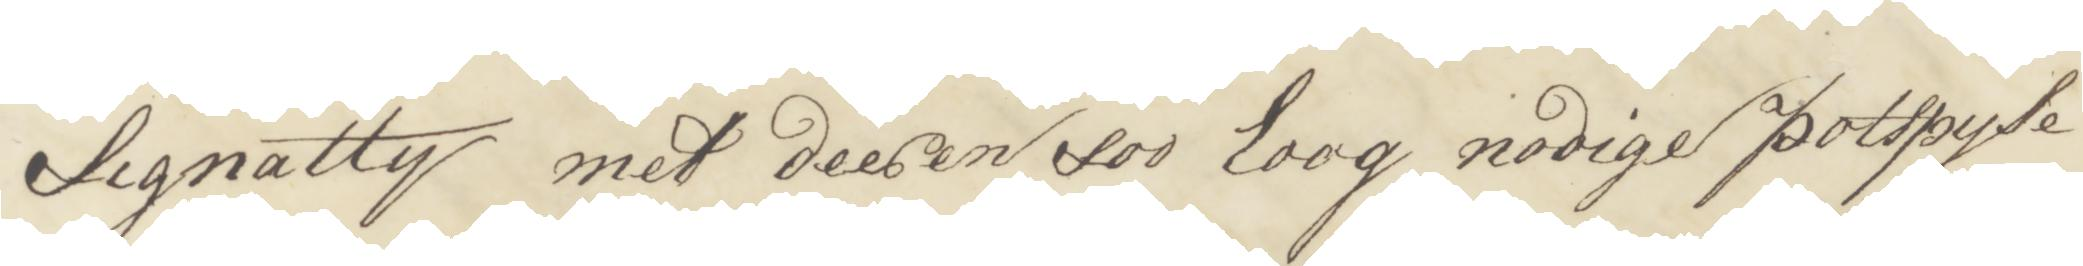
signatty met deesen soo hoog nodige potspyse
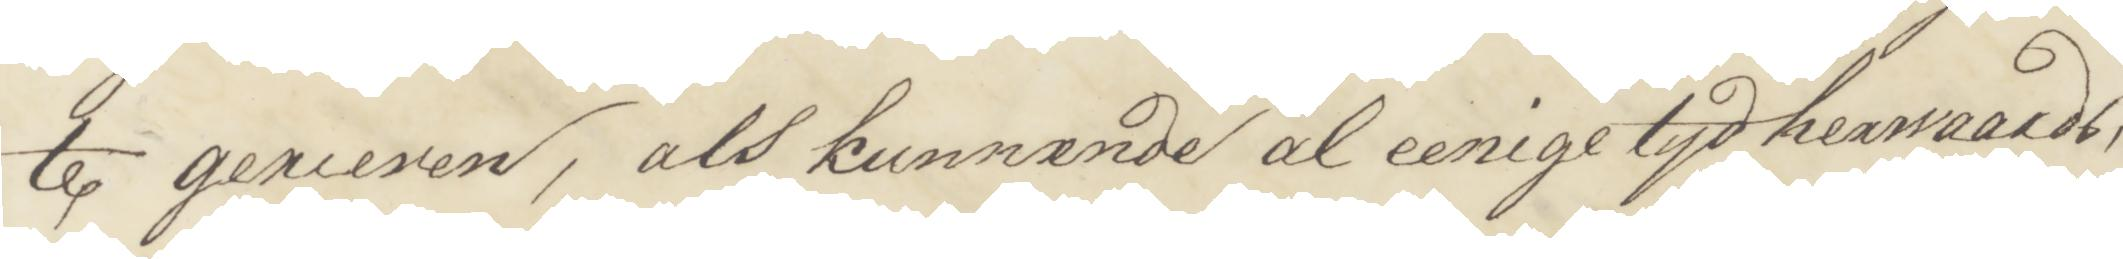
te gerieven, als kunnende al eenige tijd herwaards,
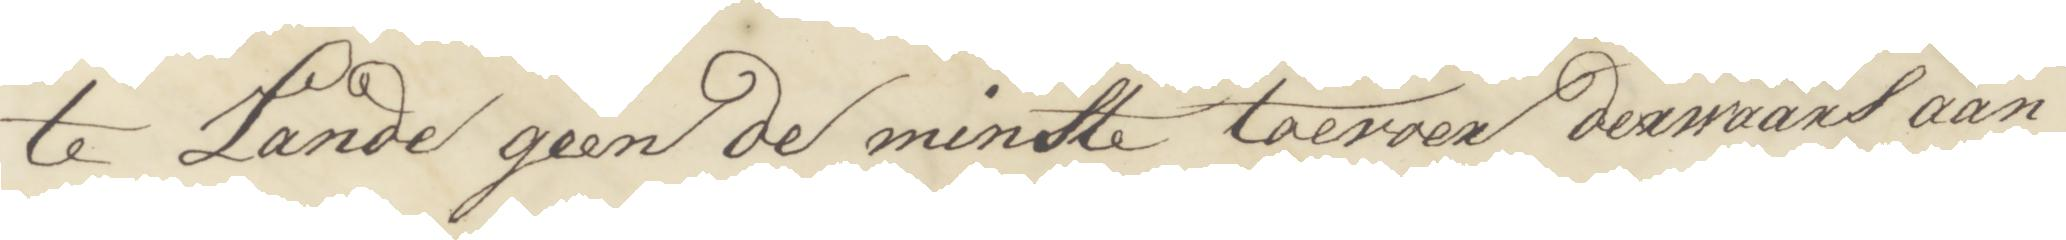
te Lande geen de minste toevoer derwaars aan
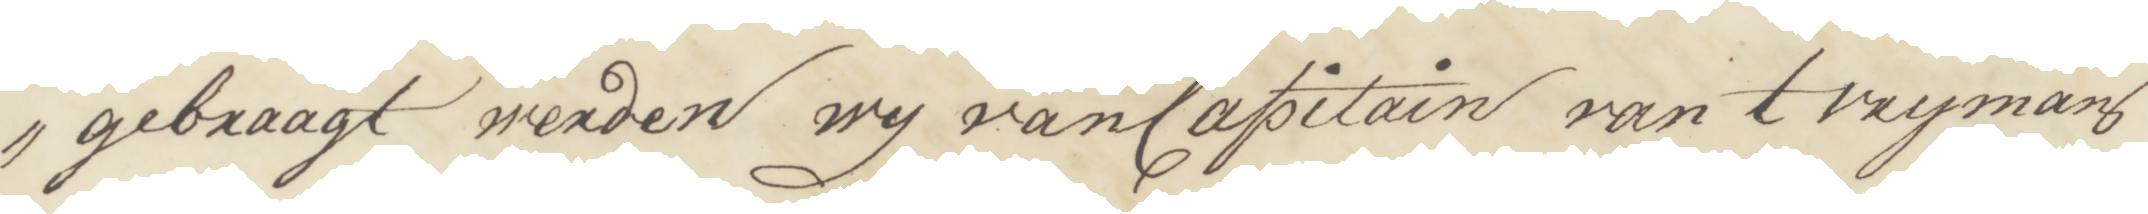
„gebraagt werden wij van Capitain van t vryman
